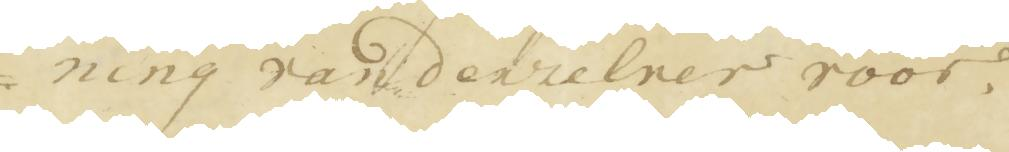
=ning van derzelver voor,
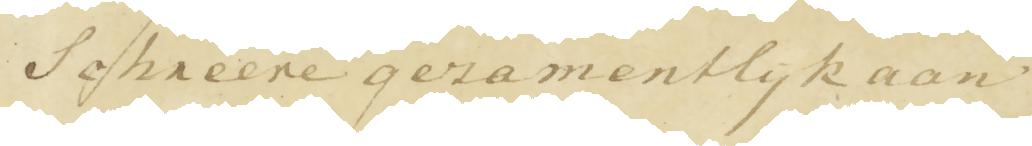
=schreeve gezamentlijk aan
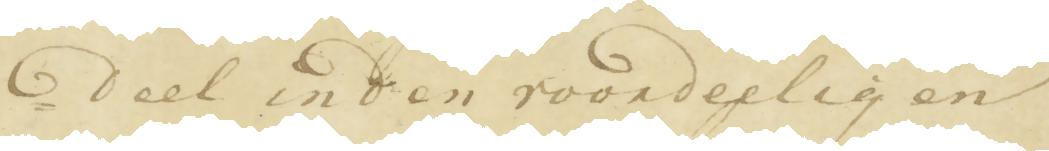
=deel in den voordeelig en
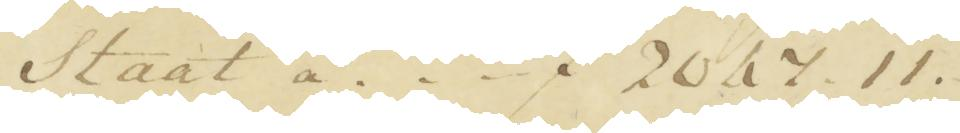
Staat a . . . . ƒ 2047. 11. —
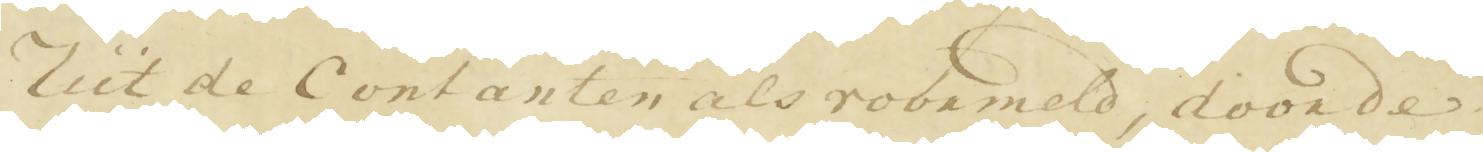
Uit de contanten als voormeld, door de
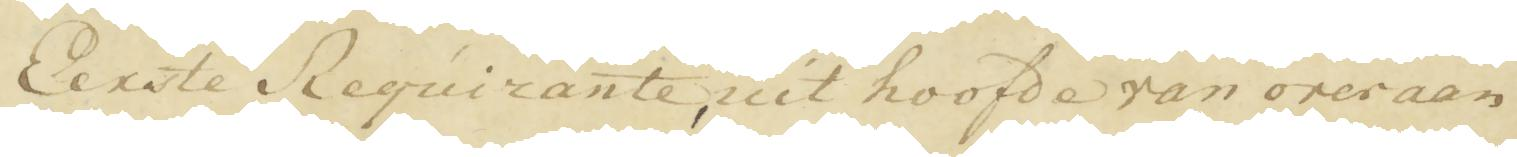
Eerste Requirante uit hoofde van over aan
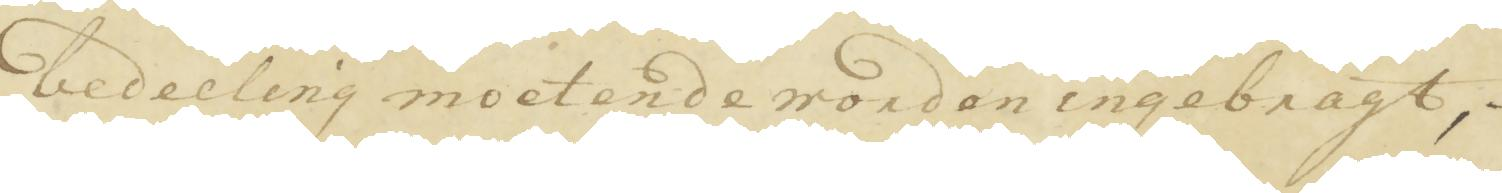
=bedeeling moetende worden ingebragt,
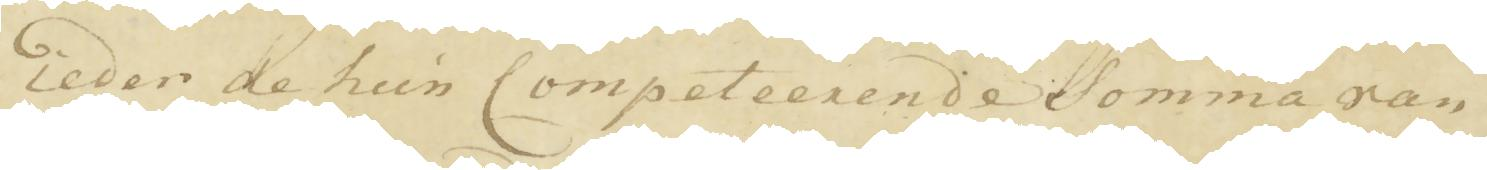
ieder de hun Competeerende somma van
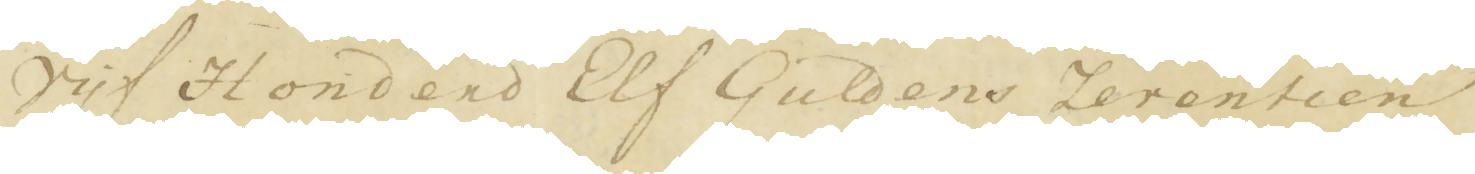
Vijf Honderd Elf Guldens Zeventien
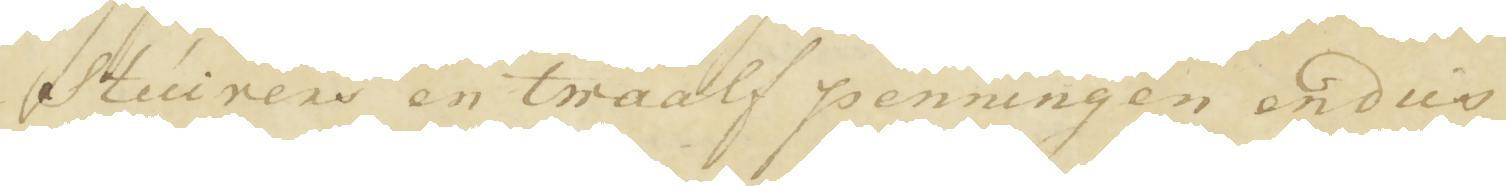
Stuivers en twaalf penningen en dus
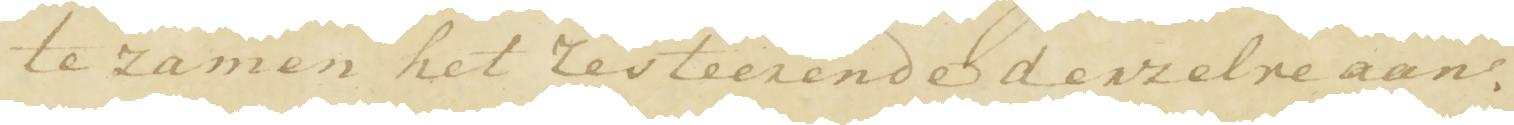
te zamen het resteerende derzelve aan,
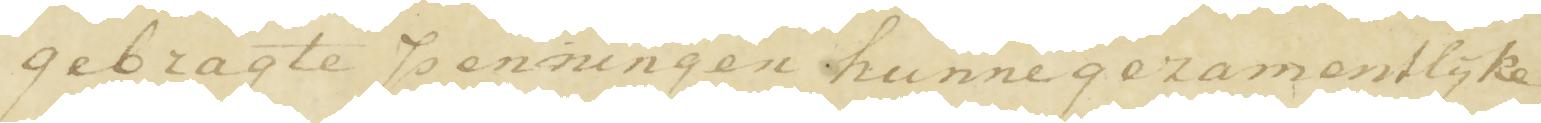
–gebragte penningen hunne gezamentlijke
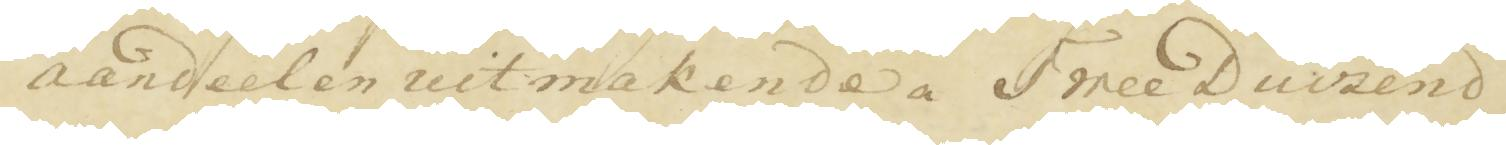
aandeelen uitmakende a Twee Duizend
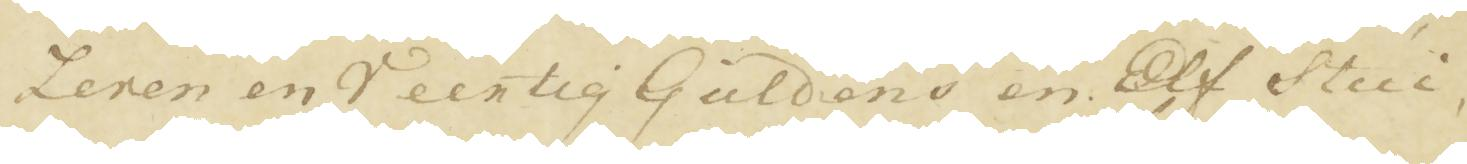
Zeven en Veertig Guldens en Elf stui,
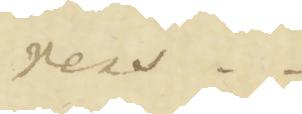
=vers - - - - - - - - - - - - . ƒ 2047. 11. —
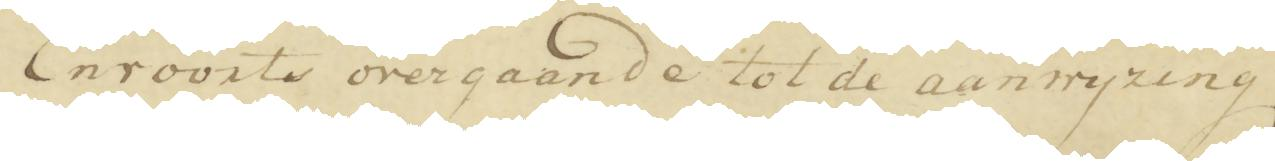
Envoorts overgaande tot de aanwyzing
